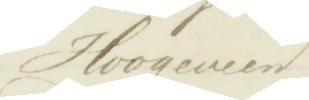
Hoogeveen
